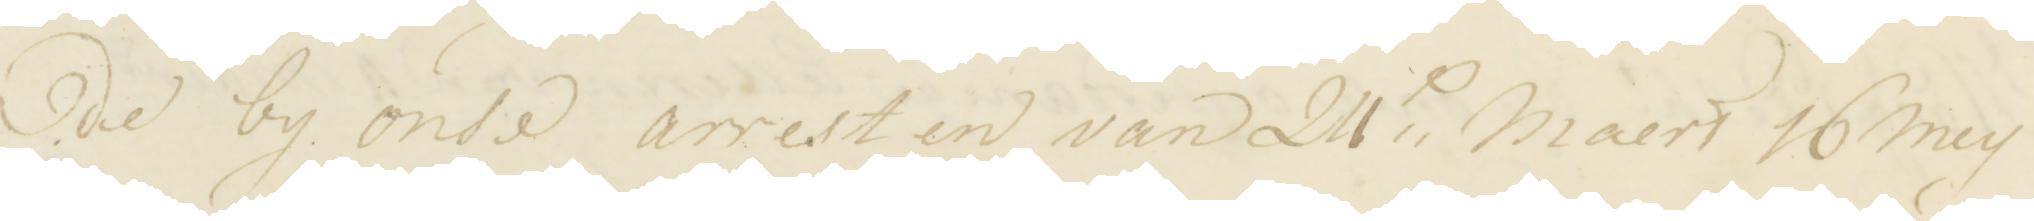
de by onse arresten van 24„e maert 16 mey
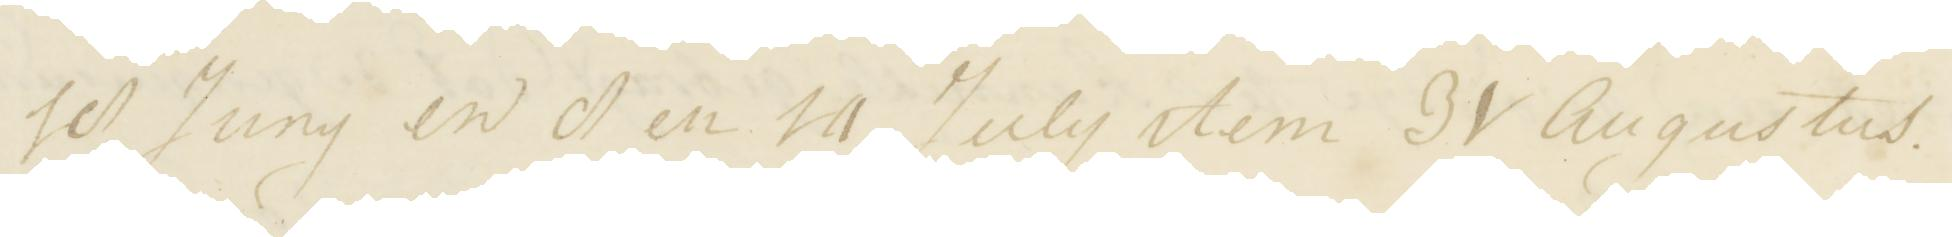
18 Juny en 8 en 14 July item 31 Augustus.
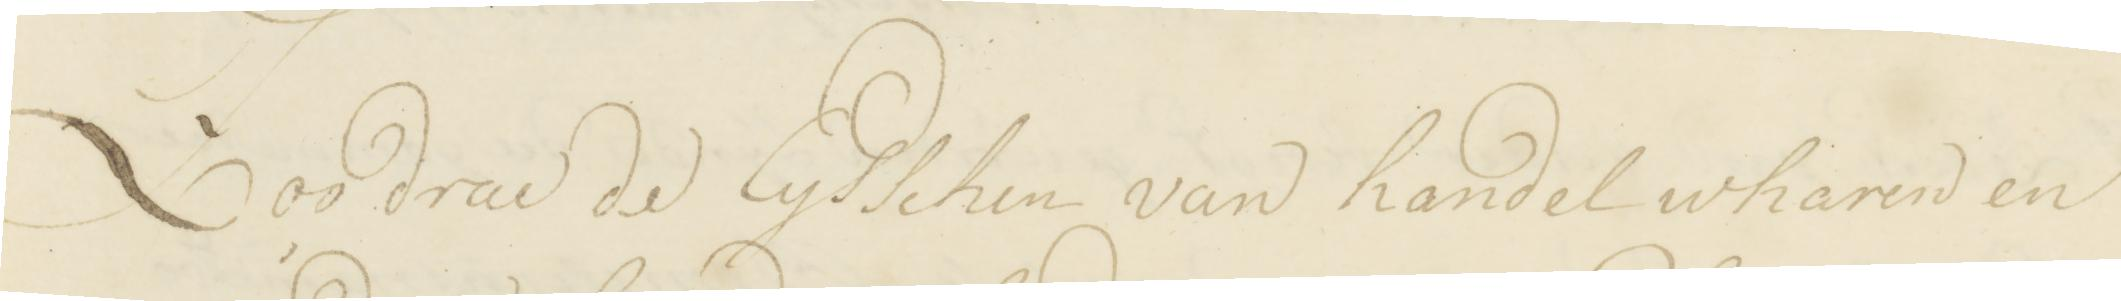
Zoo drae de Eysschen van handel wharen en
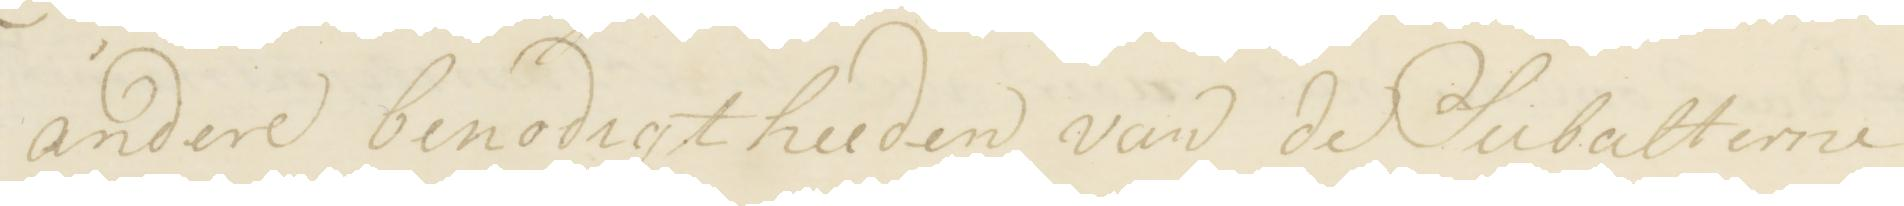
andere benodigtheeden van de Subalterne
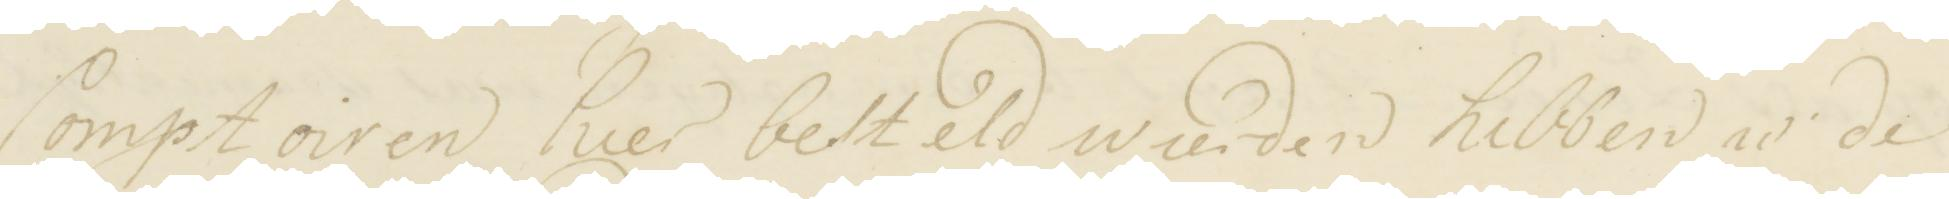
Comptoiren hier besteld wierden hebben w' de
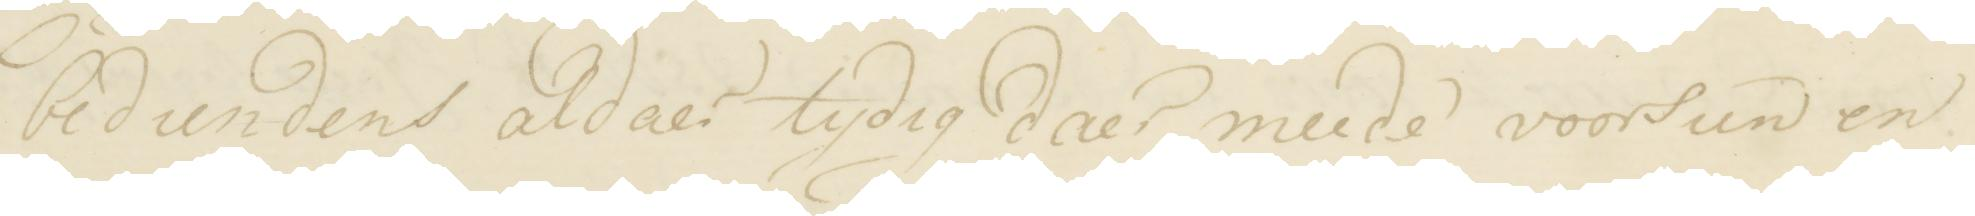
bediendens aldaer tydig daer meede voorsien en
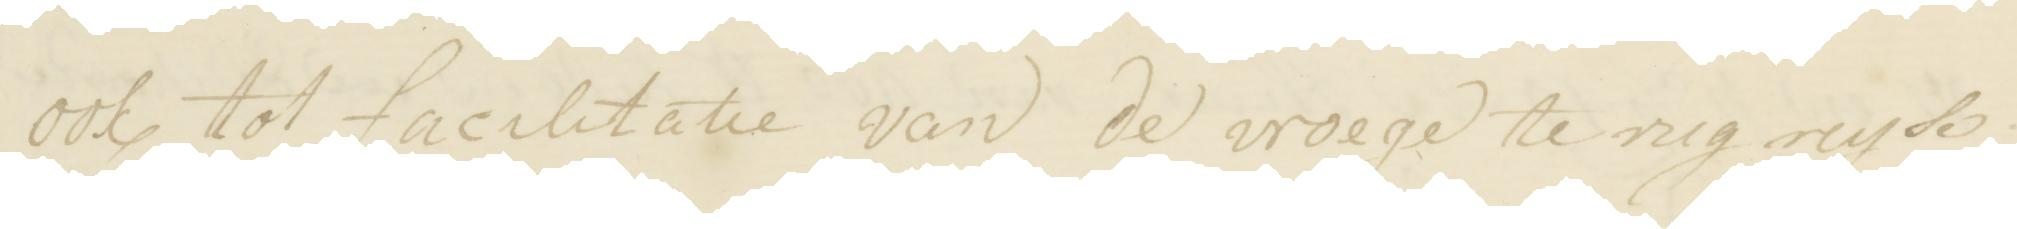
ook tot facilitatie van de vroege te rug reyse
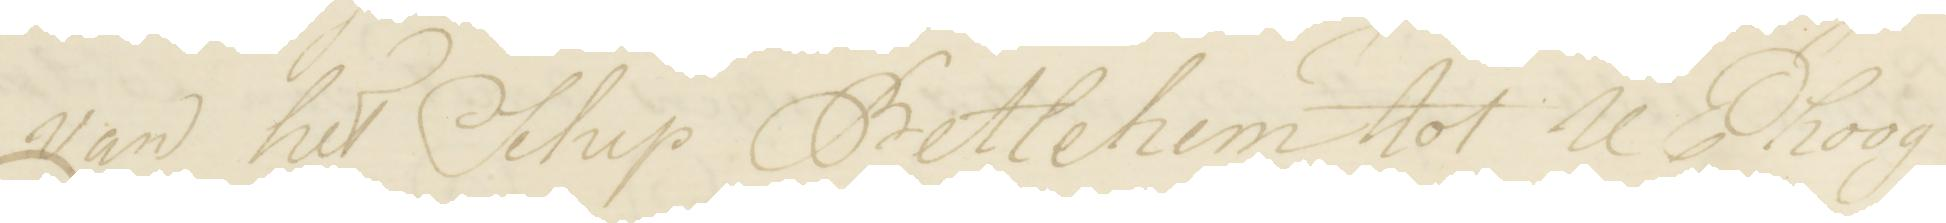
van het schip Betlehem tot U E hoog
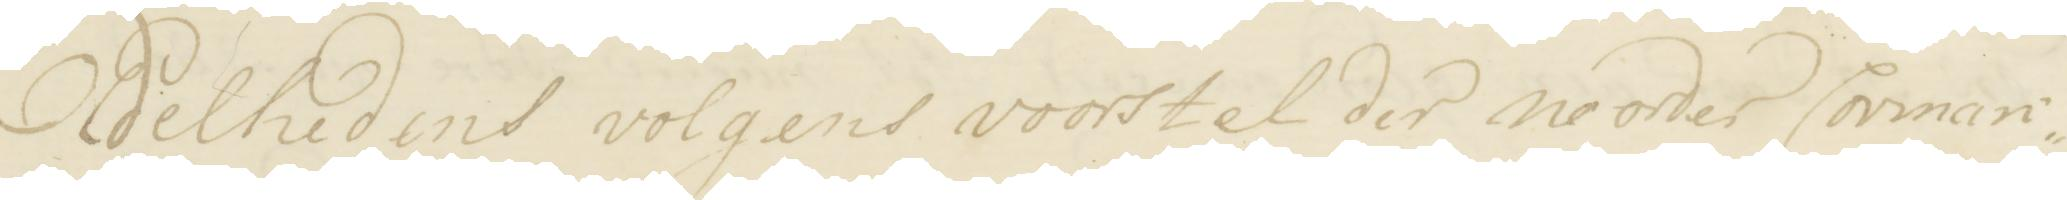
Edelhedens volgens voorstel der noorder Corman„
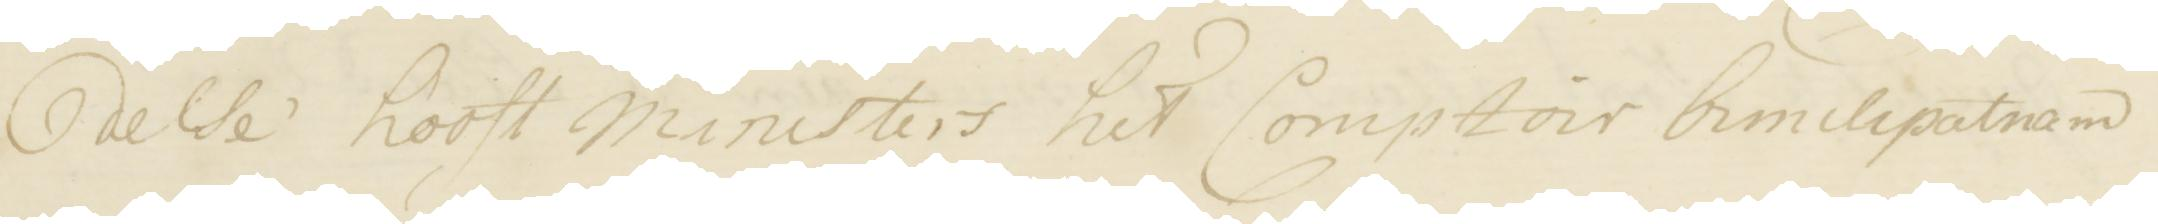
delse hooft ministers het Comptoir bimilipatnam
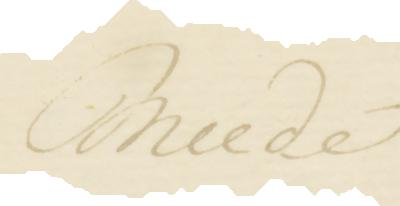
Meede
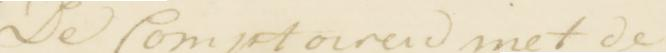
De Comptoiren met de
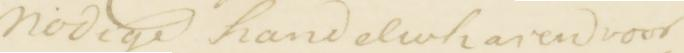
nodige handelwharen voor
